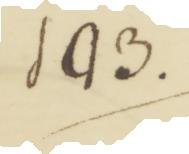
143.
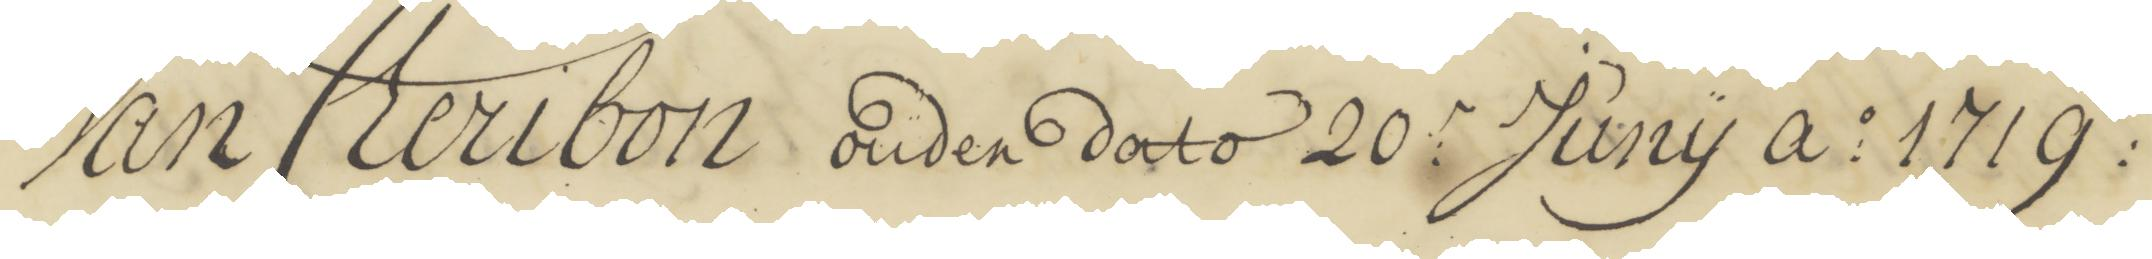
Van Cheribon onder dato 20:' Junij a:o 1719:
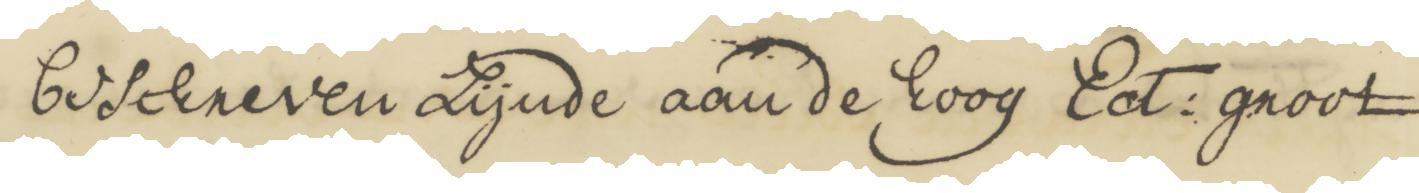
beschreven zijnde aan de hoog Ed: groot
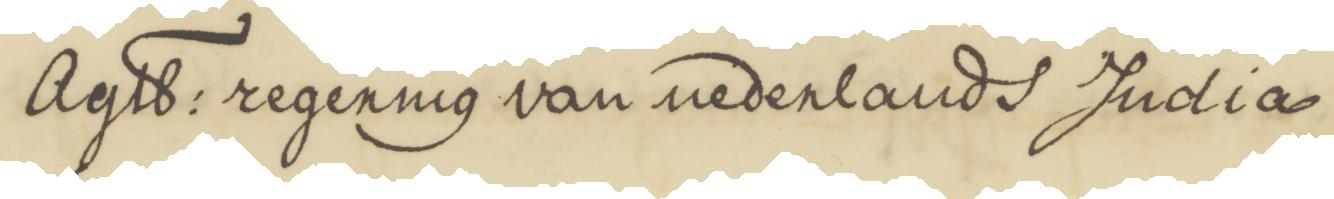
Agtb: regering van nederlands Jndia
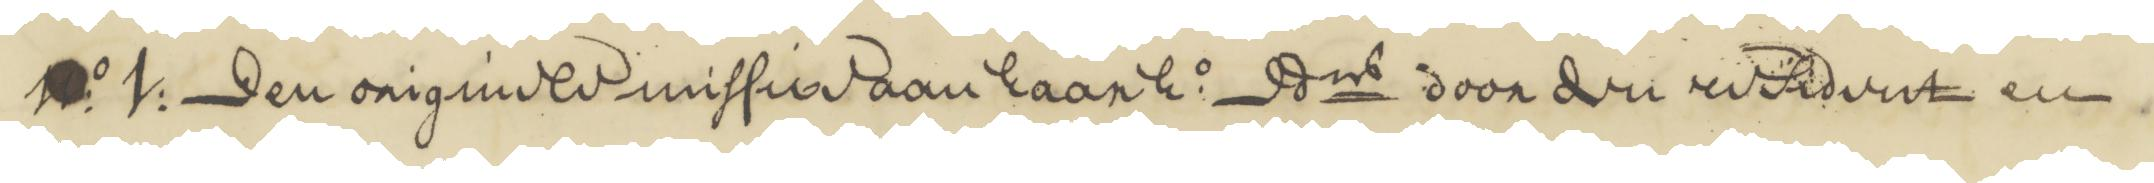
N:o 1: Een originele missive aan haar h.o Ed=ns door den resident en
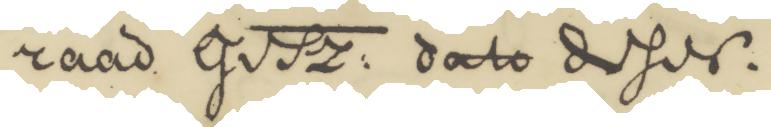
raad gesz: dato deses.
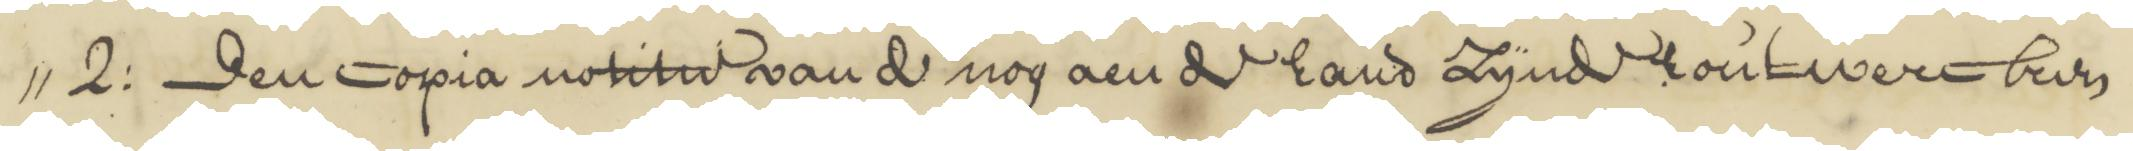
„ 2: een Copia notitie van de nog aen de hand Zijnde houtwercken
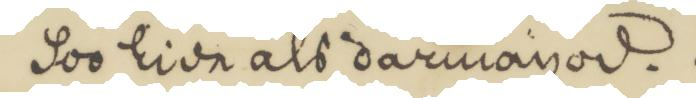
soo hier als darmaijoe.
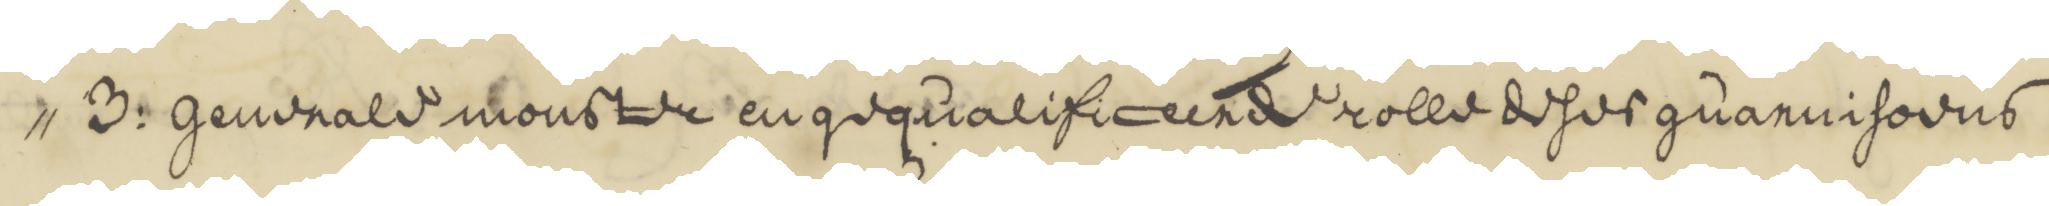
„ 3: generale monster en gequalificeerde rolle deses guarnisoens
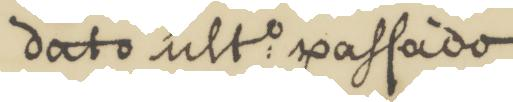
dato ult:o passado.
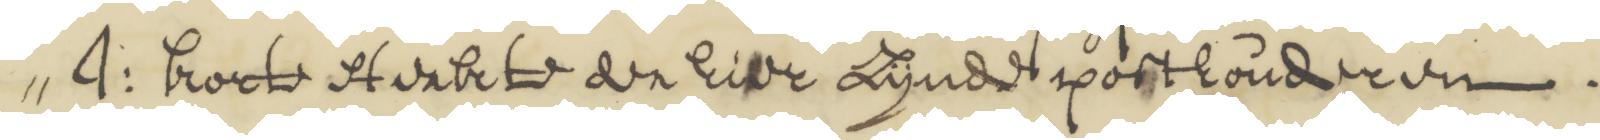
„ 4: korte sterkte der hier Zijnde posthouderen.
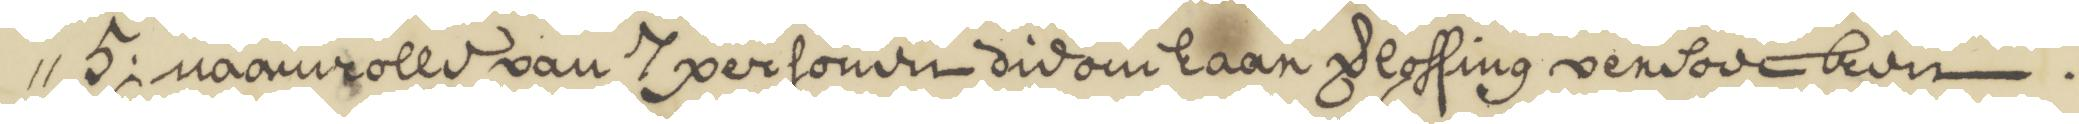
„ 5: naamrolle van 7 personen die om haar verlossing versoecken.
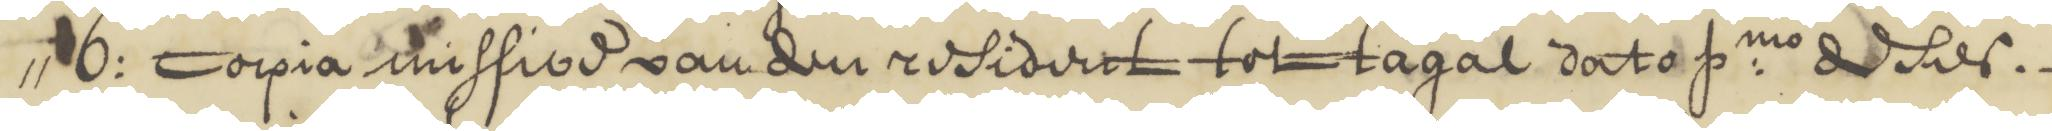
„ 6: Copia missive van den resident tot tagal dato p:mo deses.
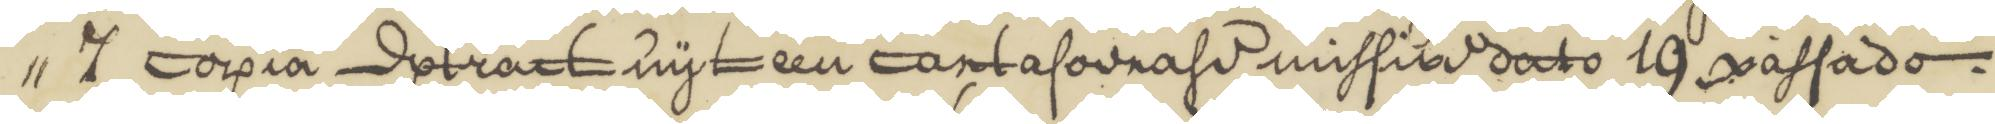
„ 7 copia Extract uijt een cartasoerase missive dato 19 passado.
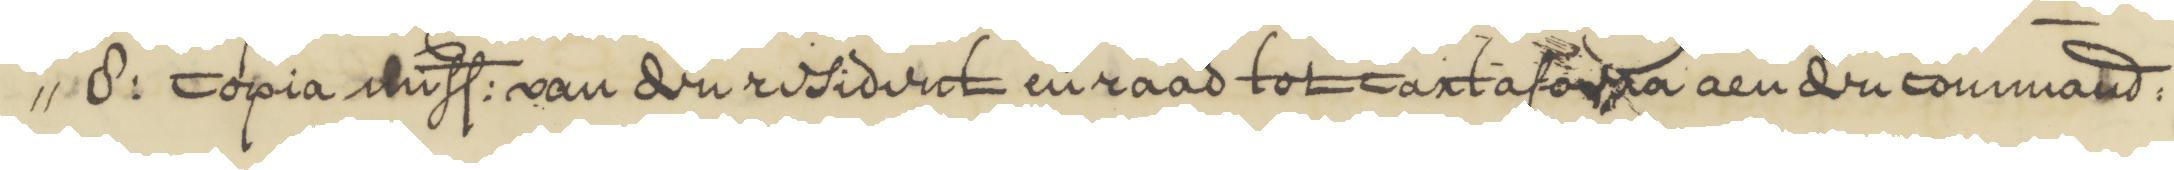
„ 8: Copia miss: van den resident en raad tot cartasoera aen den command:
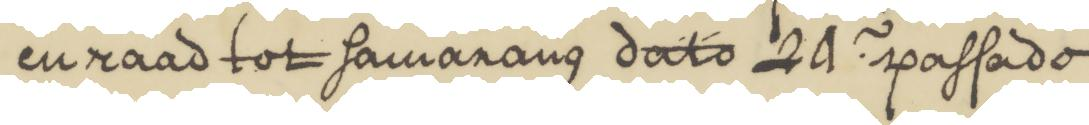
en raad tot samarang dato 24:' passado.
